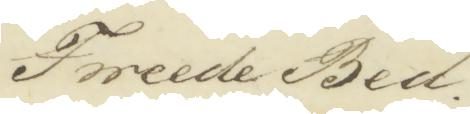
Tweede Bed.
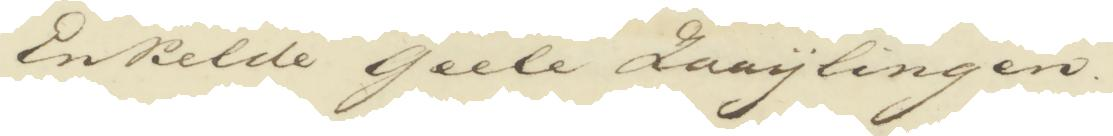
Enkelde geele Zaaijlingen.
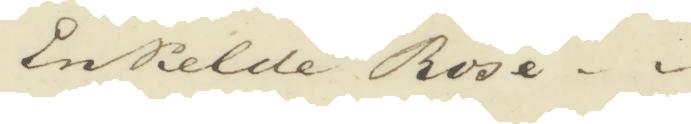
Enkelde Rose -
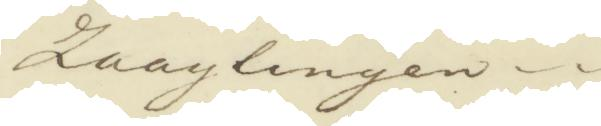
Zaaylingen
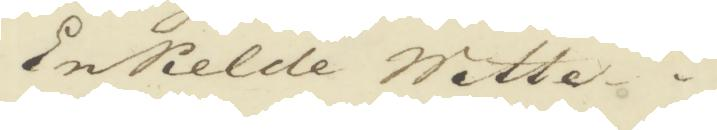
Enkelde witte
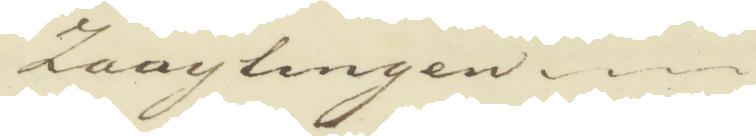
Zaaylingen.
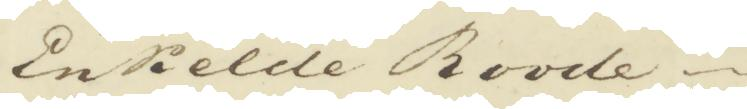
Enkelde Roode
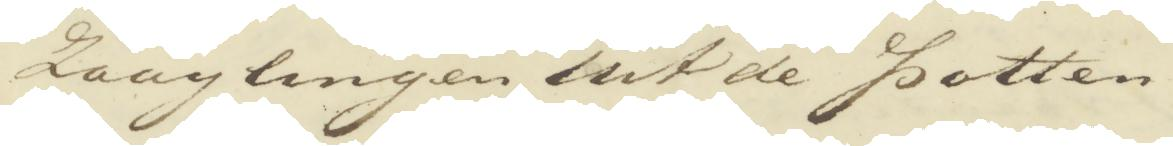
Zaaylingen uit de potten
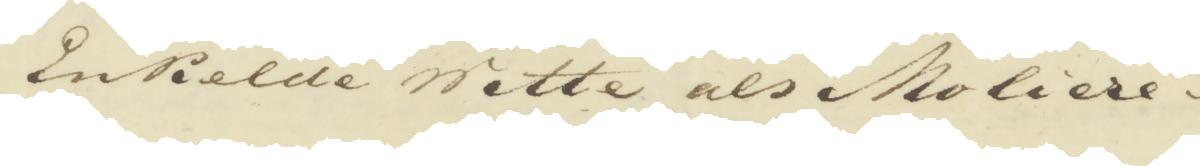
Enkelde witte als Molière
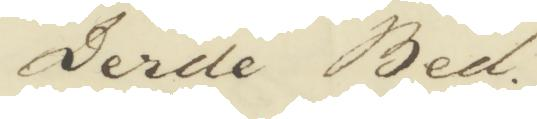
Derde Bed.
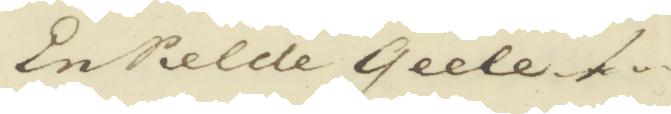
Enkelde geele.
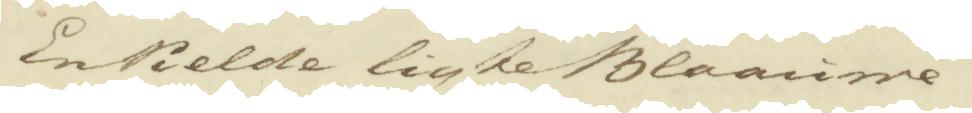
Enkelde ligte Blaauwe
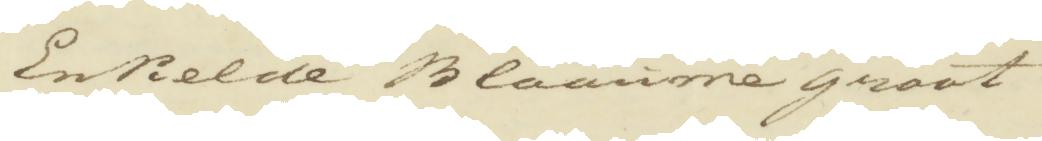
Enkelde Blaauwe Groot
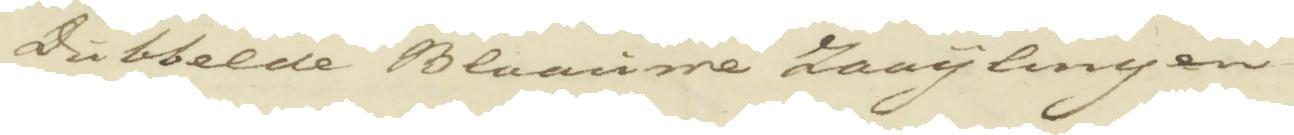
Dubbelde Blaauwe Zaaijlingen
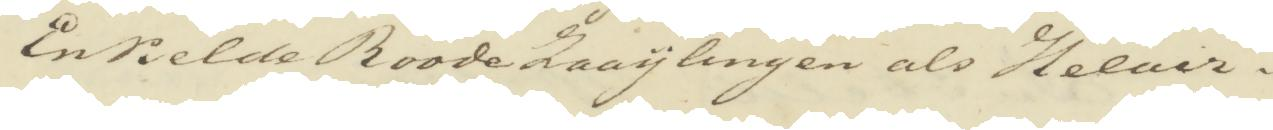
Enkelde Roode Zaaijlingen als Helair
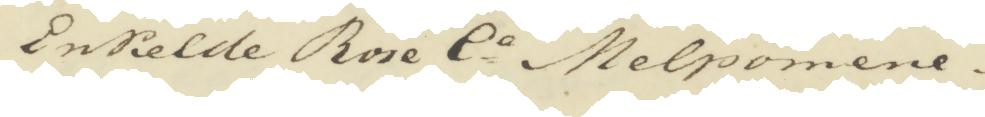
Enkelde Rose C=a Melpomene.
